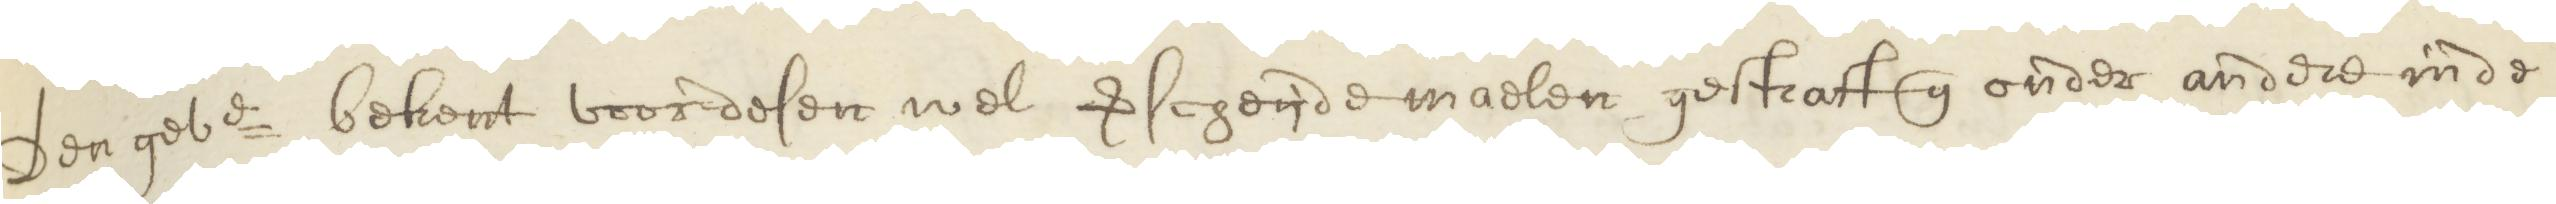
Den gev=e bekent voor desen wel verscheijde maelen gestraft ende onder andere in de
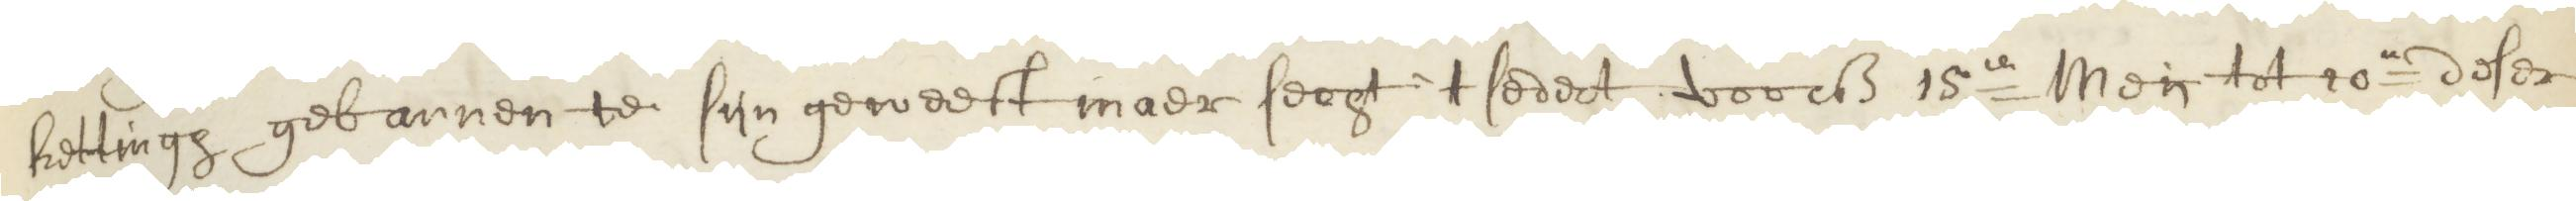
kettingh gebannen te sijn geweest maer secht ’t sedert voorꞵ 15=en Meij tot 20=e deser
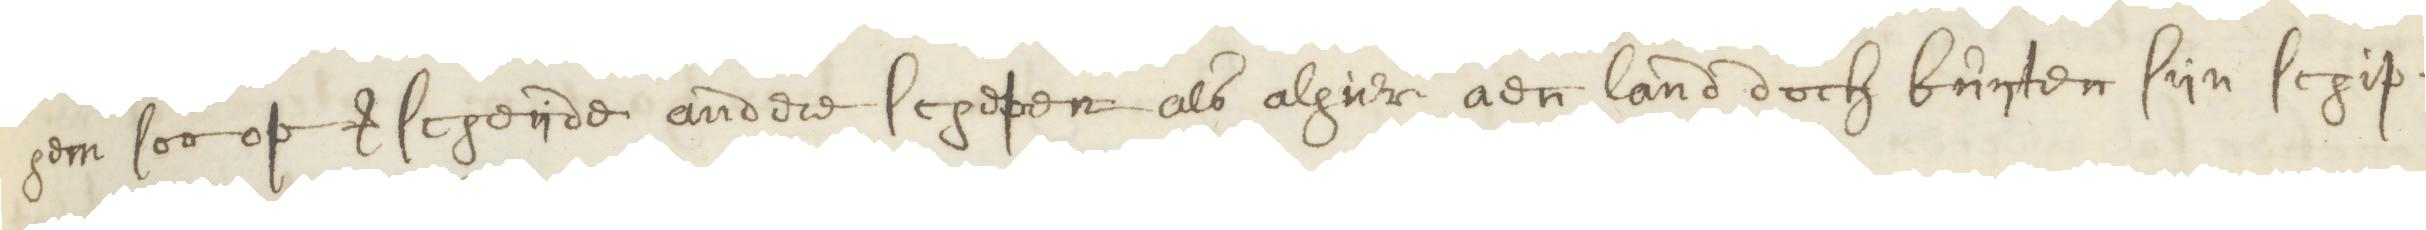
hem soo op verscheijde andere schepen als alhier aen land doch buyten sijn schip
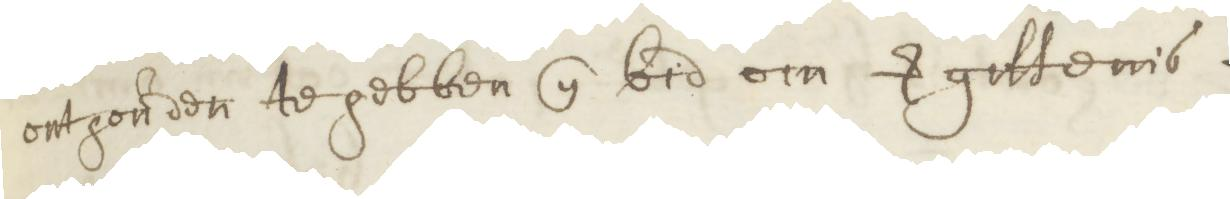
onthouden te hebben ende bid om vergiffenis
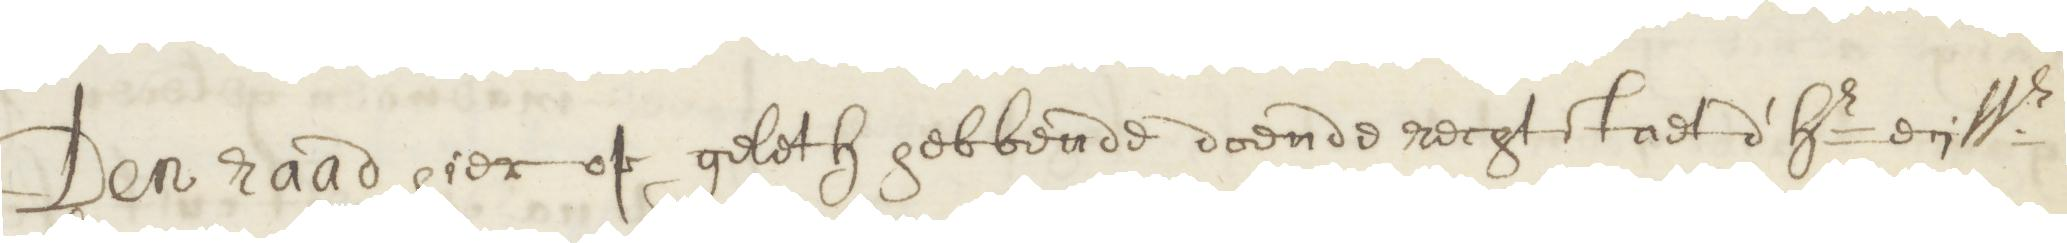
Den raad hier op geleth hebbende doende recht staet d’ h=r eijss=r
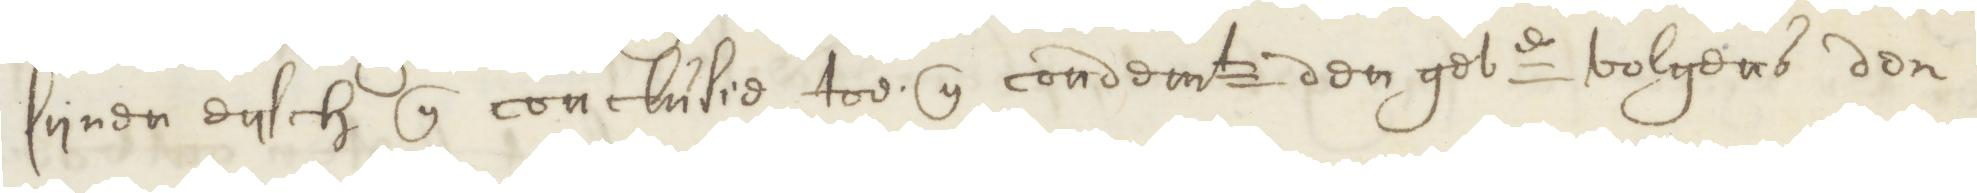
sijnen eysch ende conclusie toe ende condem=t den gev=e volgens den
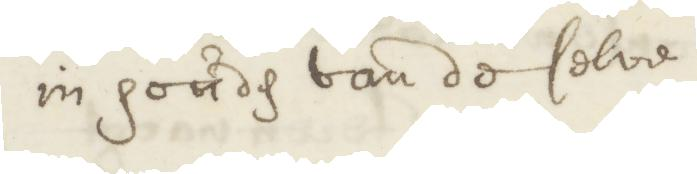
in houden van de selve
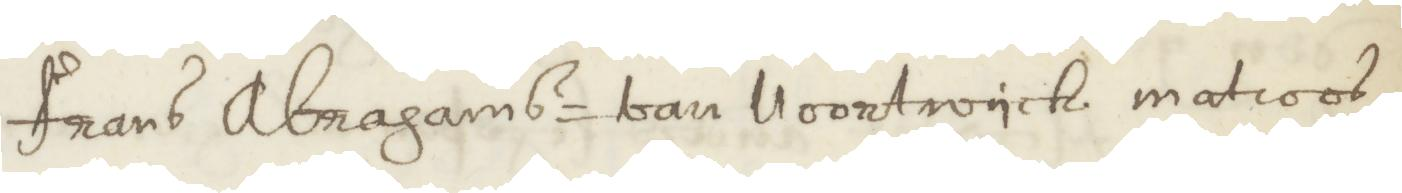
frans Abraham=' van Noortwijck matroos
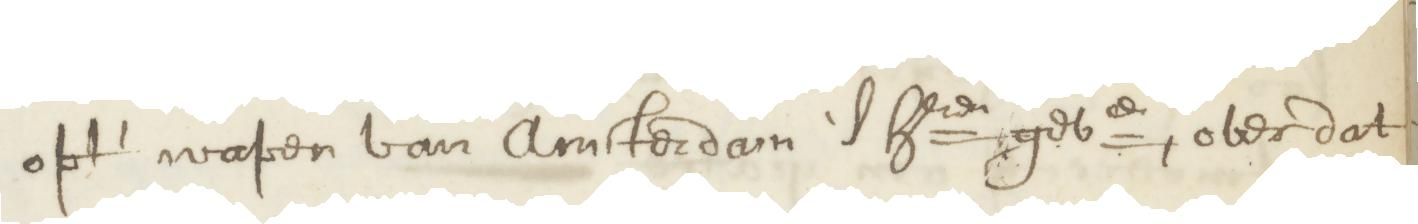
opt' wapen van Amterdam 'S h=ren gev=e, over dat
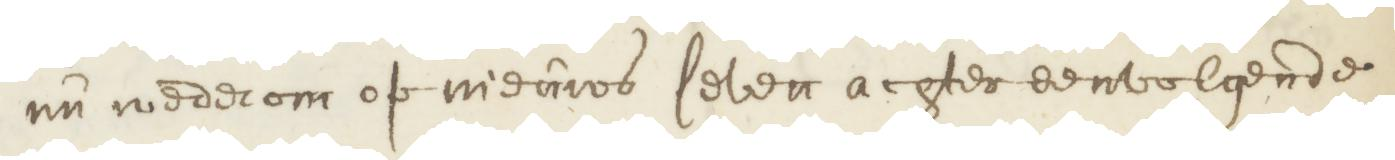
nu wederom op nieuws seven achter een volgende
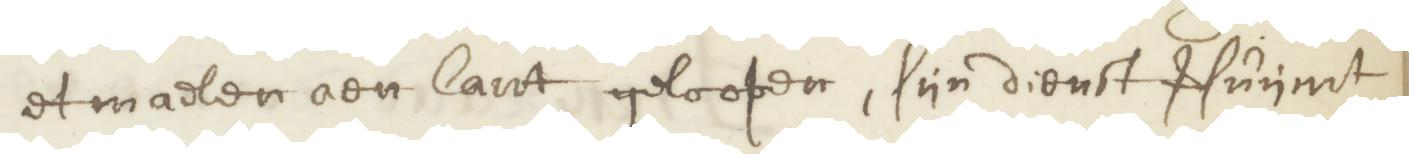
etmaelen aen lant geloopen, sijn dienst versuijmt
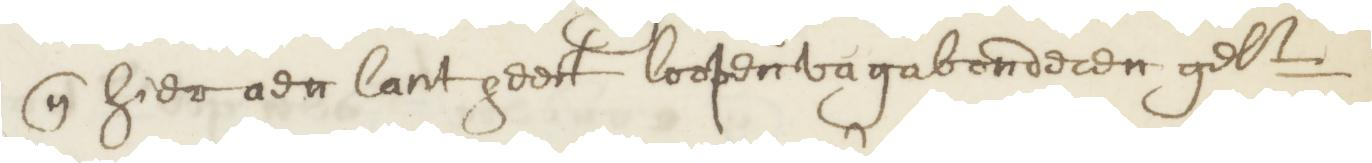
ende hier aen lant heeft loopen vagaborderen gelt
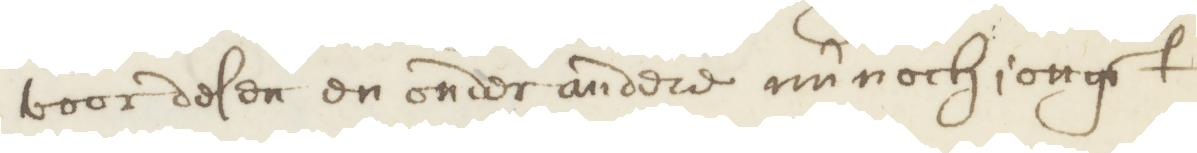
voor desen en onder andere nu noch iongst
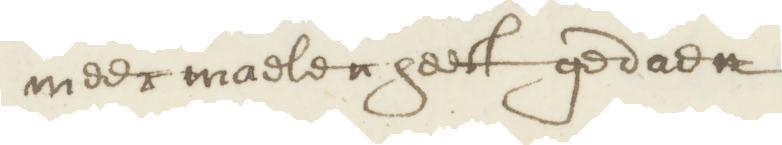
meer maeler heeft gedaen
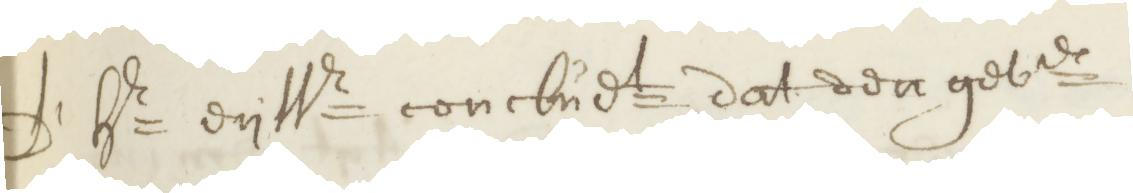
D' H=r eijss=r conclud=t dat den gev=e
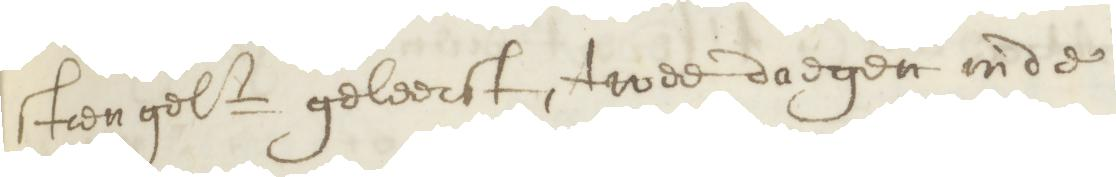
strengelijk geleerst, twee daegen in de
